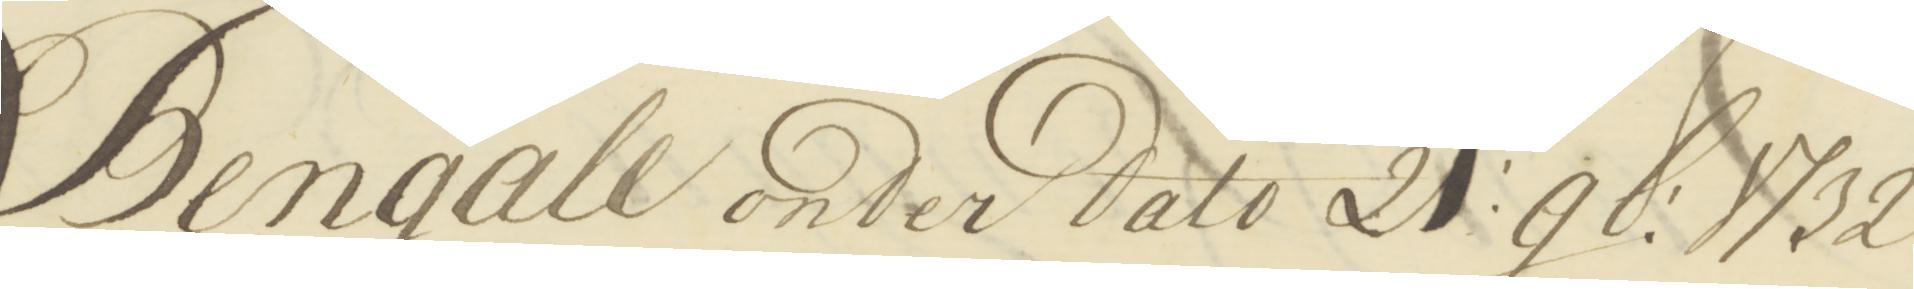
Van Bengale onder dato 21:' gb: 1732
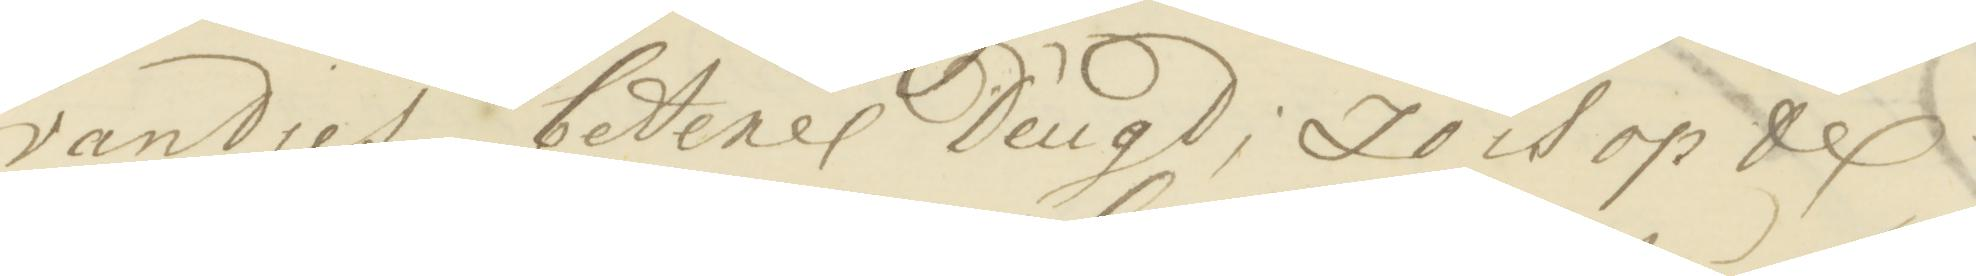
van dies betere Deugd; zo is op de
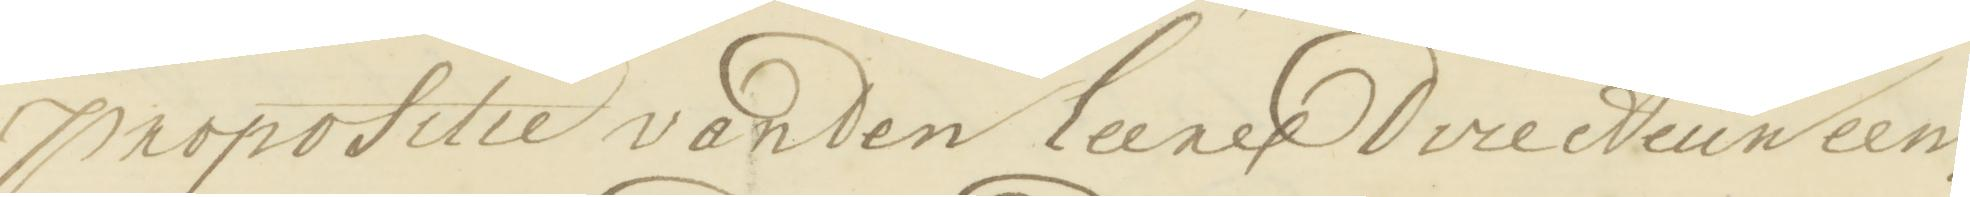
propositie van den heere Directeur een„
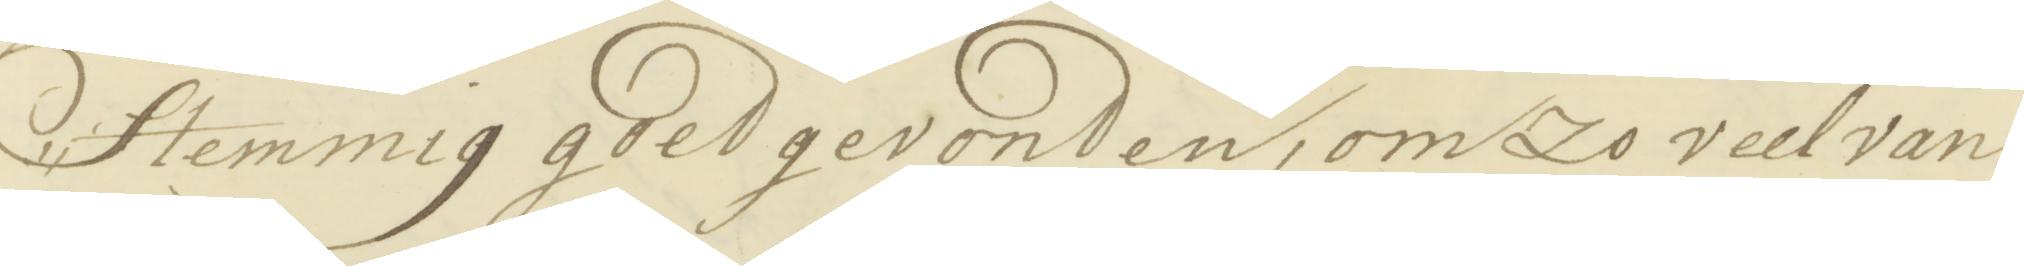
„Stemmig goed gevonden, om Zo veel van
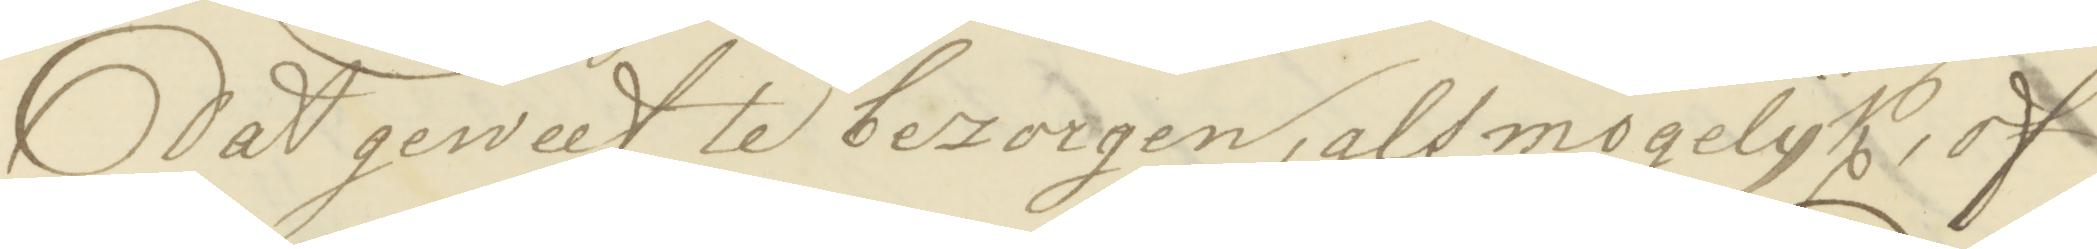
dat geweef te bezorgen, als mogelijk, of
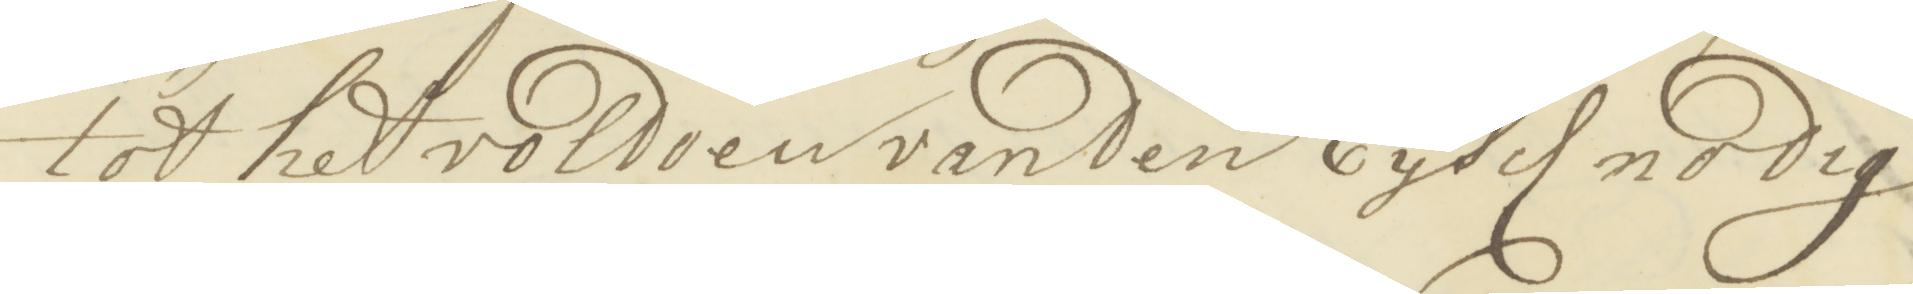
tot het voldoen van den Eijsch nodig
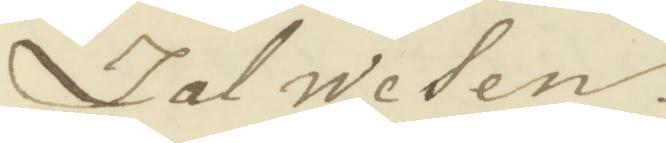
Zal wesen.
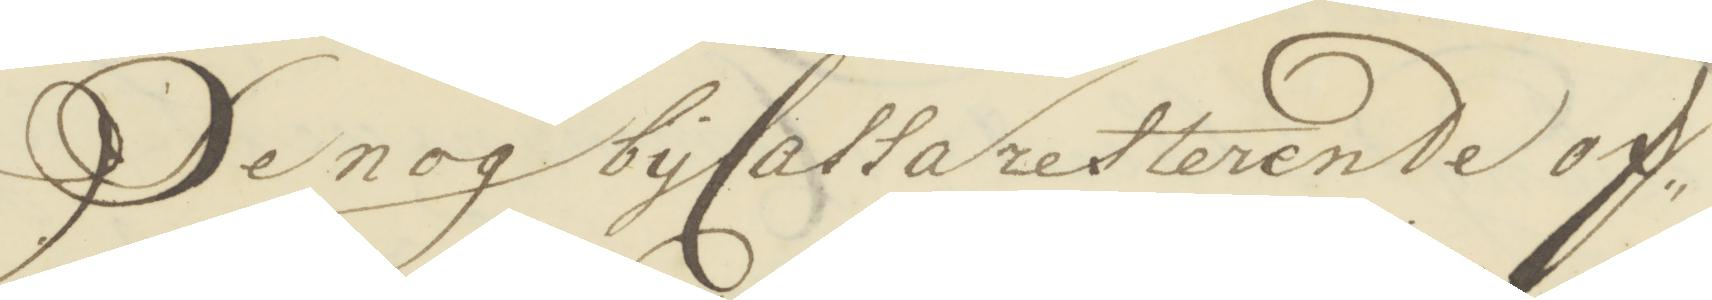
De nog bij Cassa resterende over„
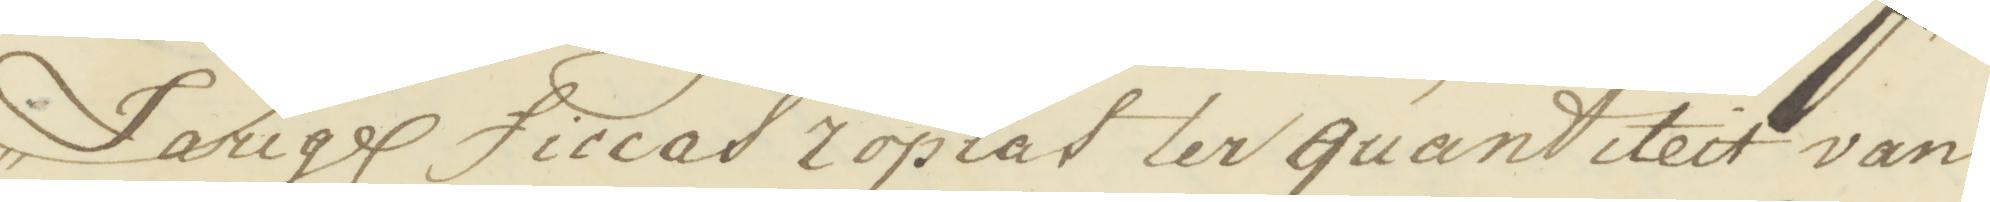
Iarige Siccas ropias ter quantiteit van
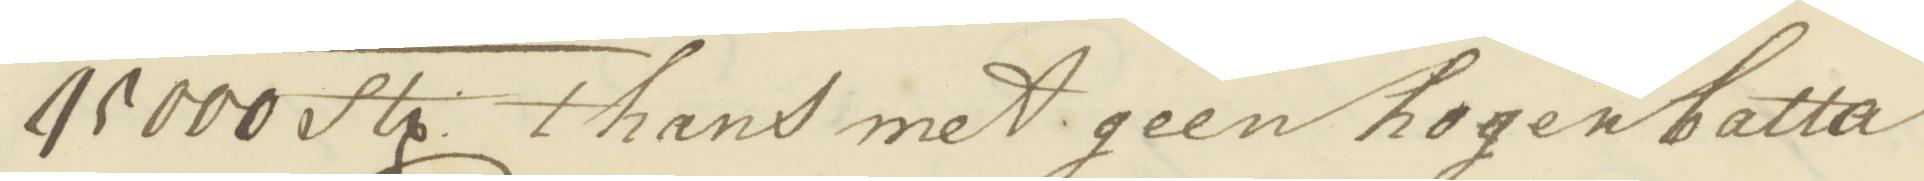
45000 stx: thans met geen hoger batta
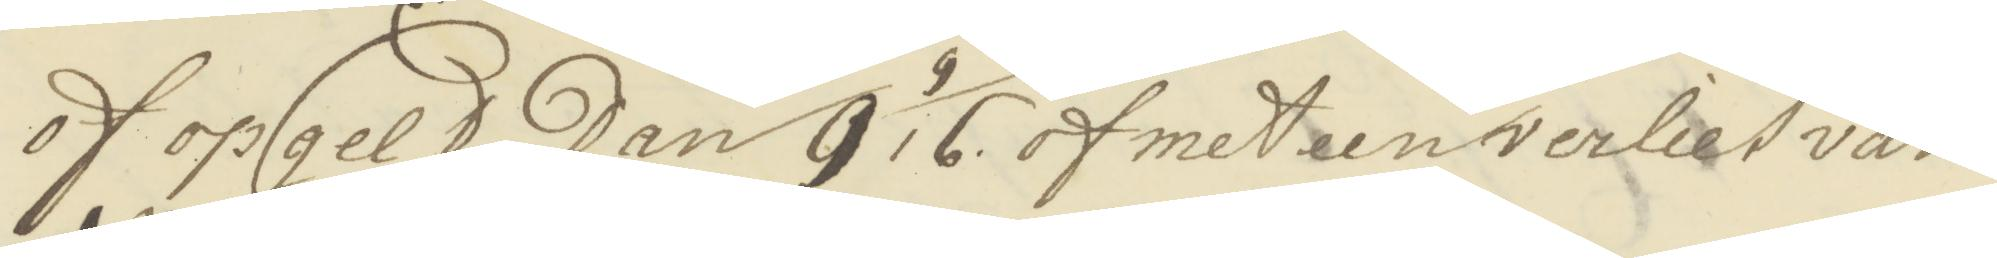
of opgeld dan 9 9/16. of met een verlies van
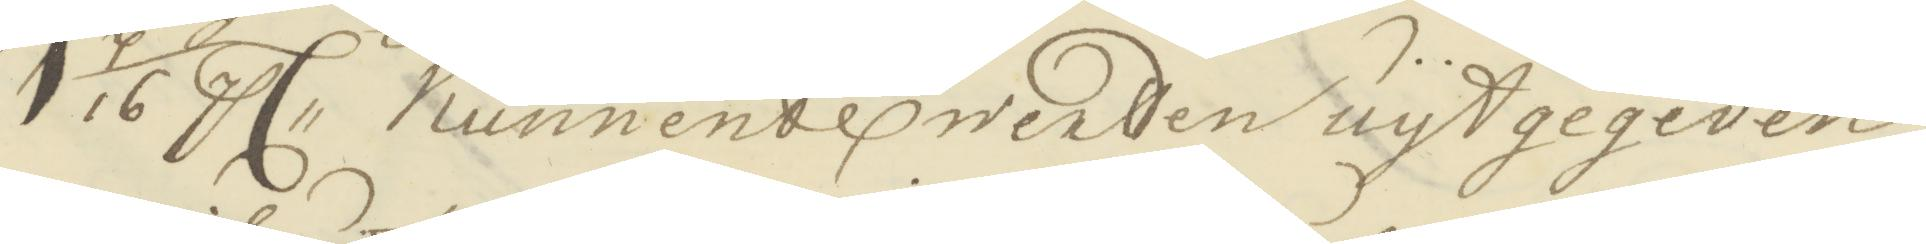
1 7/16 pC„to Kunnende werden uijtgegeven,
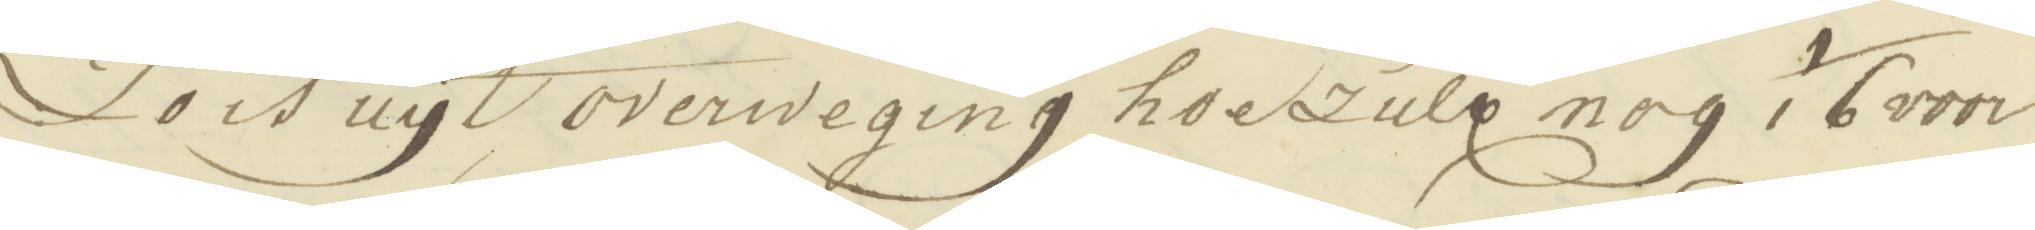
Zo is uijt overweging hoe zulx nog 1/16 voor
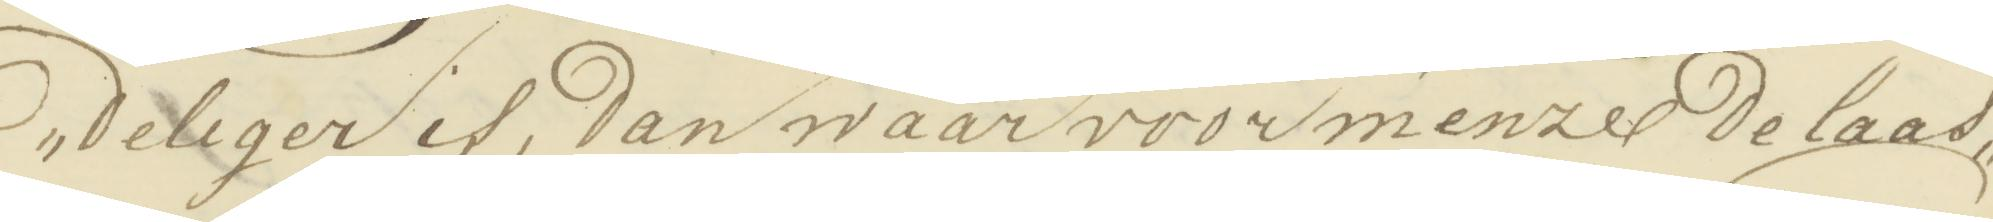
„deliger is, dan waar voor men ze de laas„
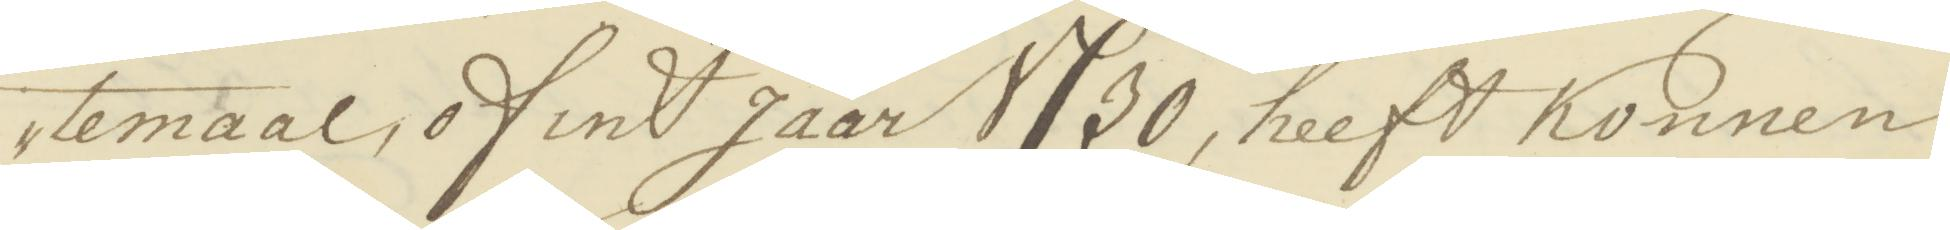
„temaal, of in 't Jaar 1730, heeft konnen
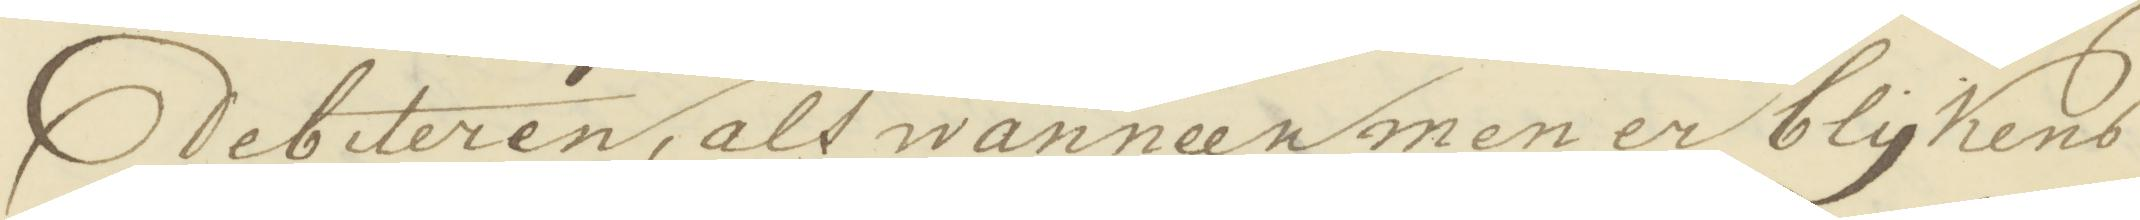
debiteren, als wanneer men er blijkens
